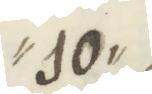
"10"
